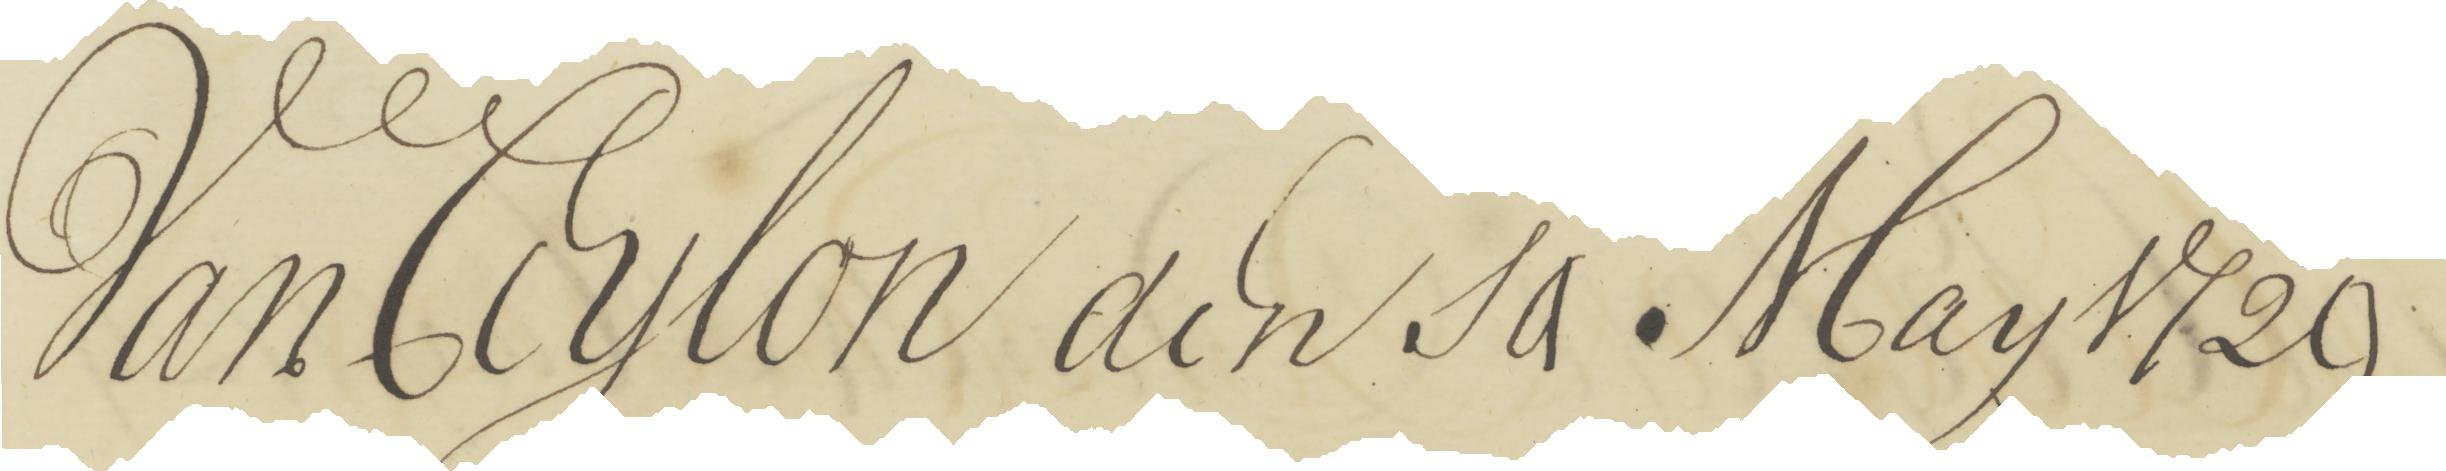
Van Ceylon den 14. May 1729
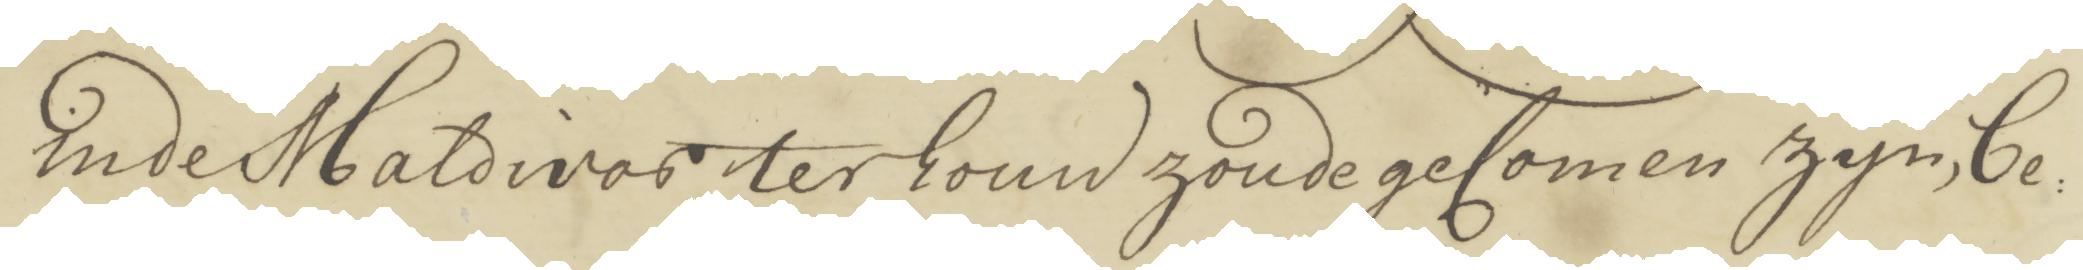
in de Maldivas ter houw zoude gecomen zijn, be:
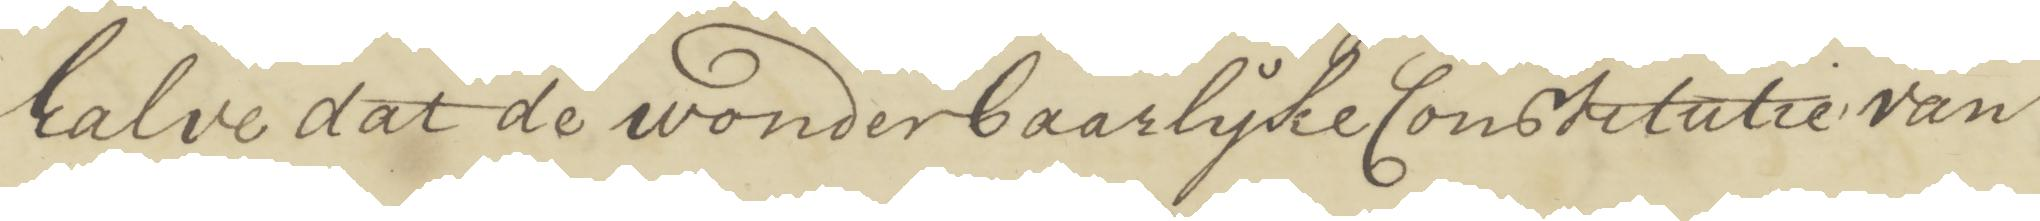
halve dat de wonderbaarlijke Constitutie van
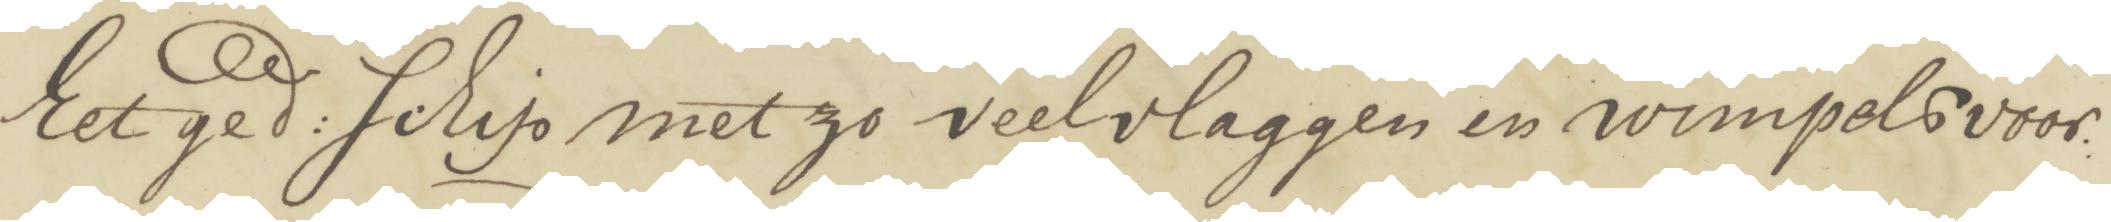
het ged: schip met zo veel vlaggen en wimpels voor:
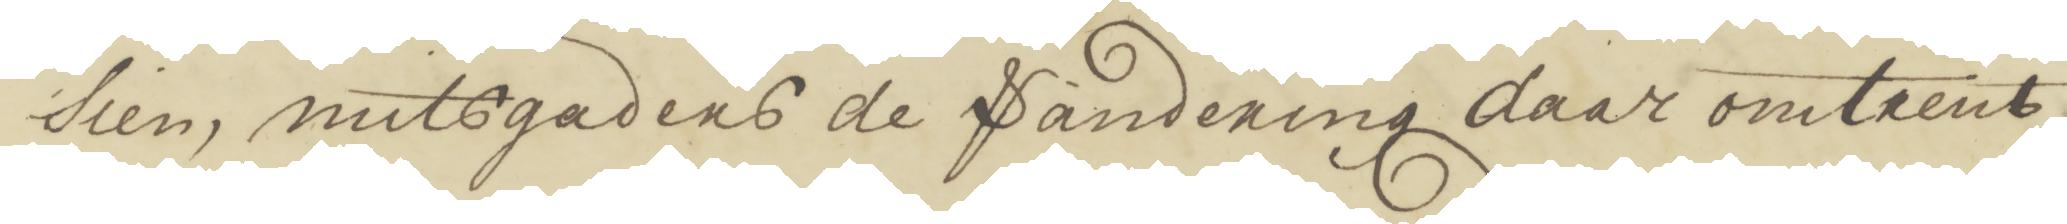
sien, mitsgaders de verandering daar omtrent
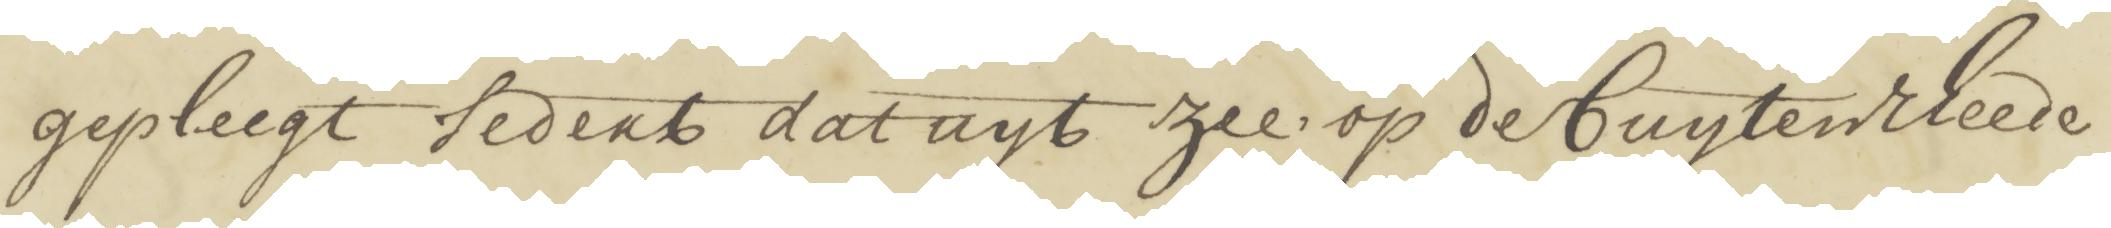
gepleegt sedert dat uijt zee, op de buytenrheede
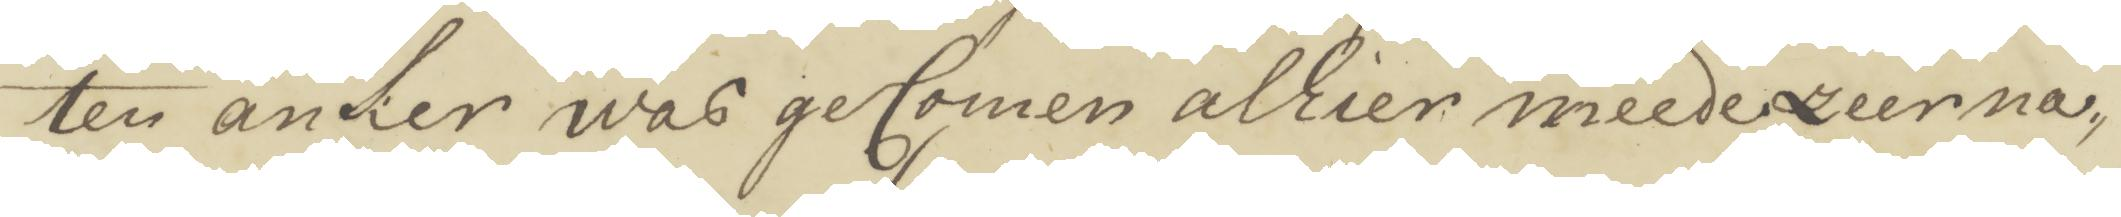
ten anker was gecomen alhier meede zeer na„
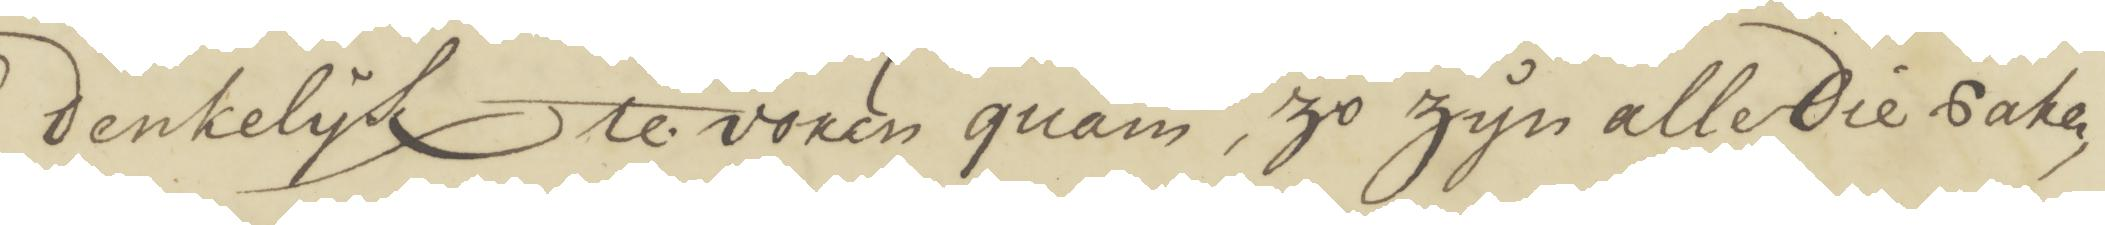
denkelijk te voren quam, zo zijn alle die saken
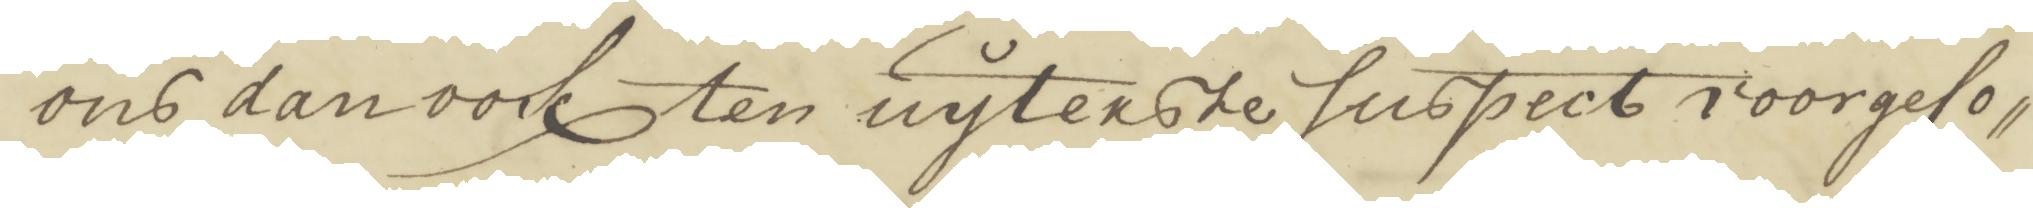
ons dan ook ten uijterste suspect voorgeco„
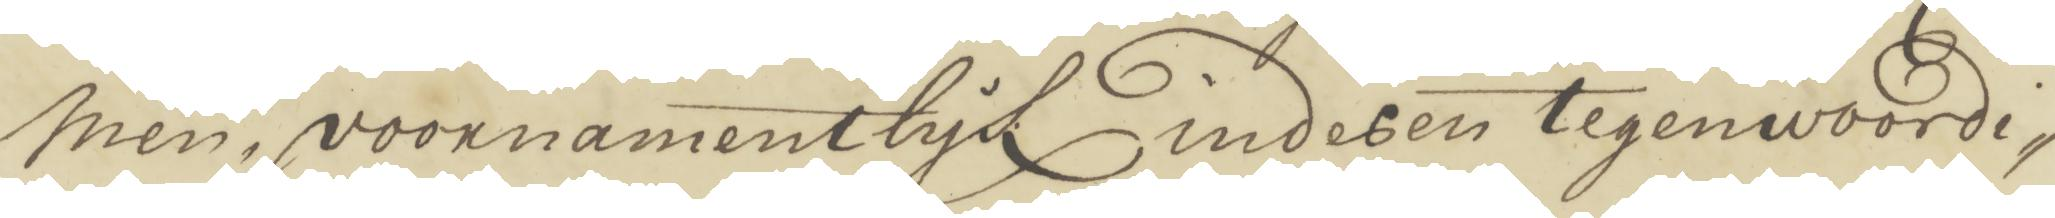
men, voornamentlijk in desen tegenwoordi„
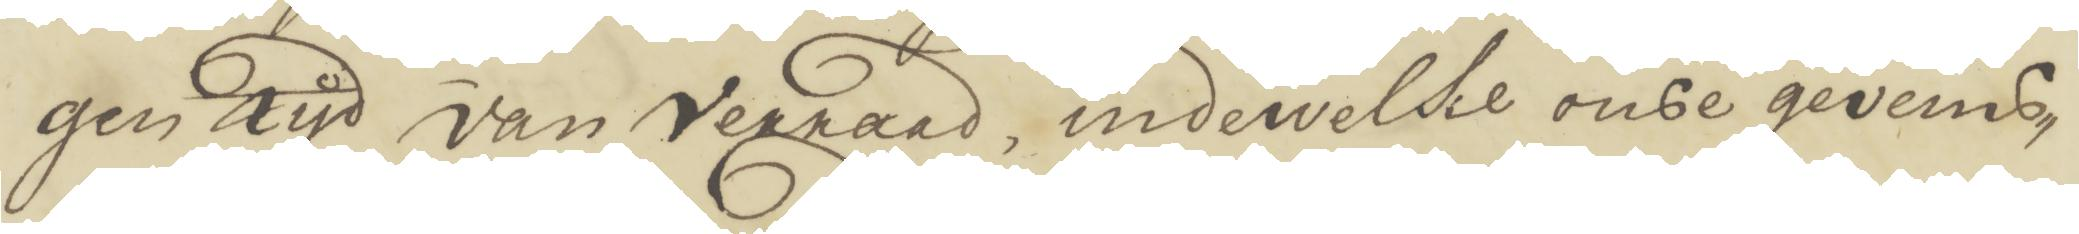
gen tijd van verraad, indewelke onse geveins„
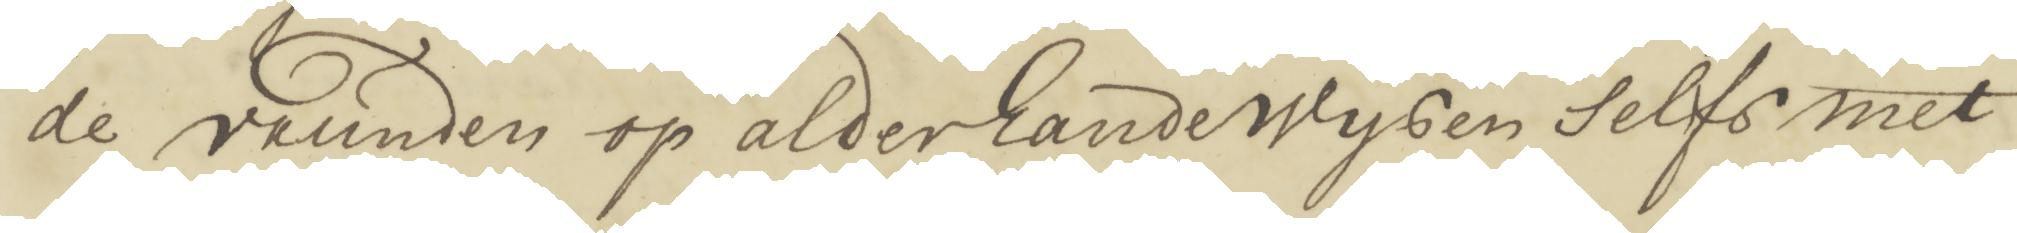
de vrunden op alderhande wijsen selfs met
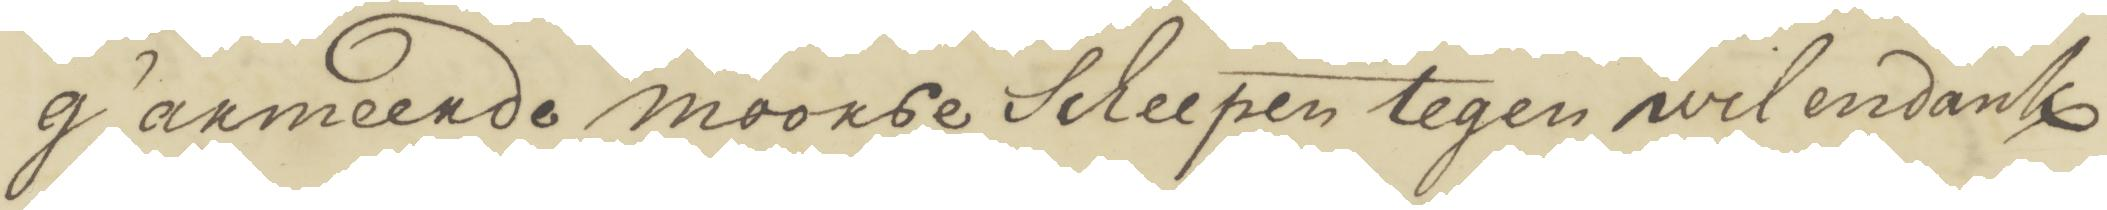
g’armeerde moorse scheepen tegen wil endank
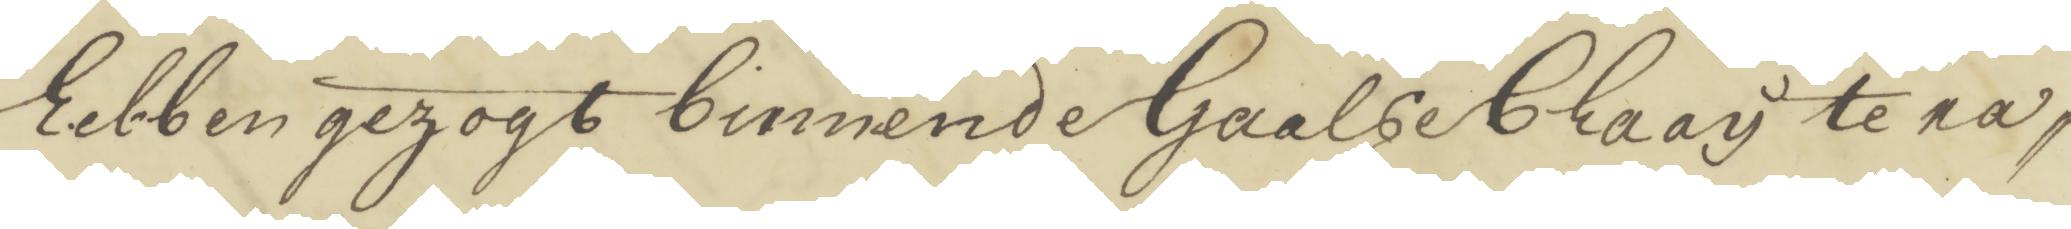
hebben gezogt binnende Gaalse bhaaij te ra
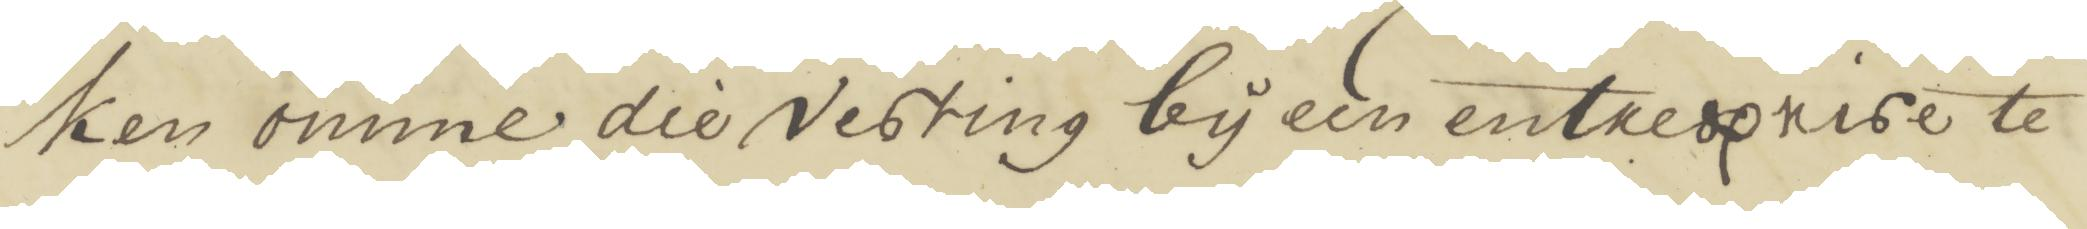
ken omme die vesting bij een entresprise te
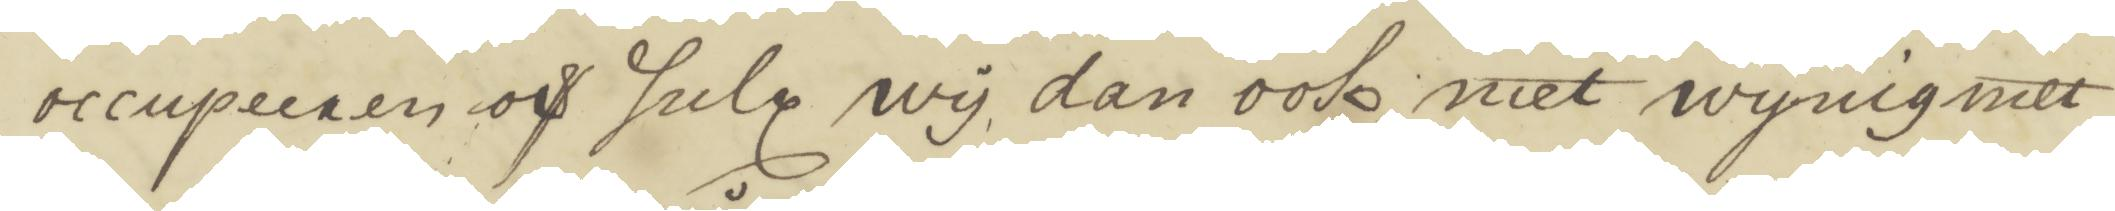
occupeeren over sulx wij dan ook niet wijnig met
